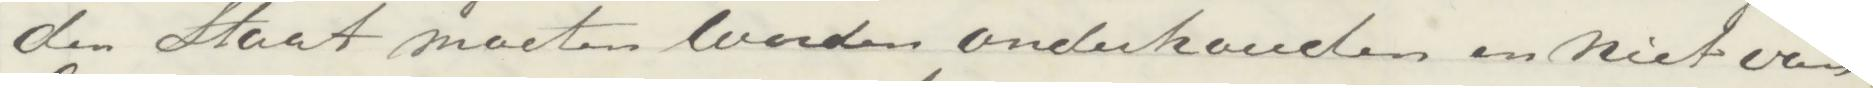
den staat moeten worden onderhouden en niet van
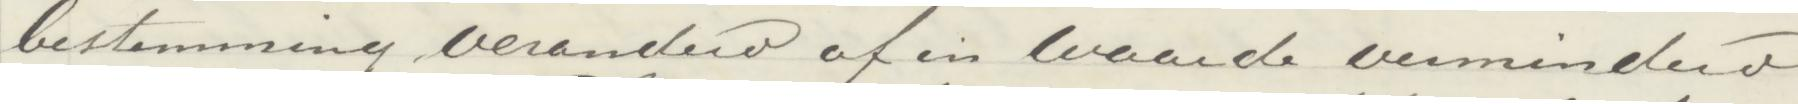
bestemming veranderd of in waarde verminderd
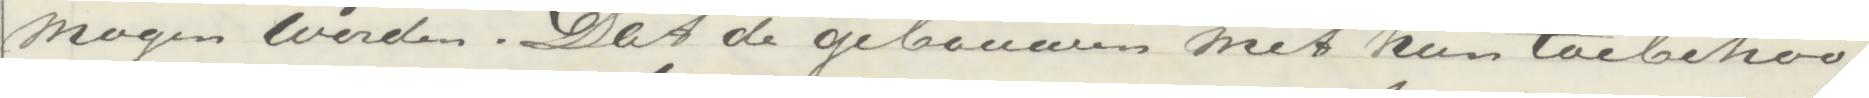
mogen worden. Dat de gebouwen met hun toebehoo
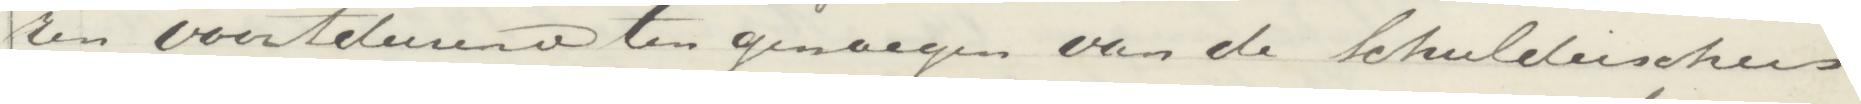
ren voortdurend ten genoegen van de schuldeischers
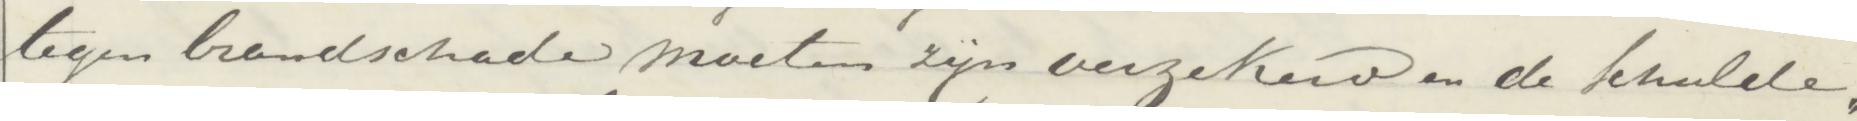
tegen brandschade moeten zijn verzekerd en de schulde,
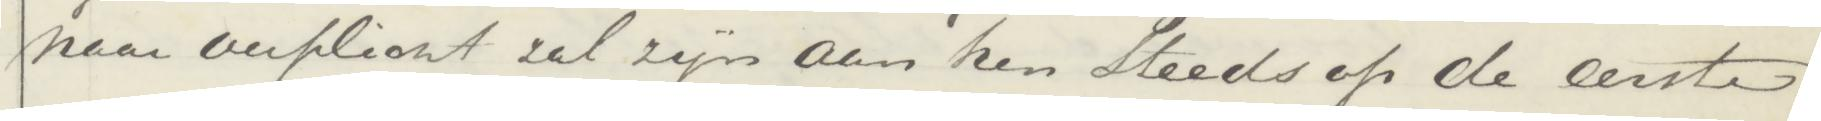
naar verplicht zal zyn aan hen steeds op de eerste
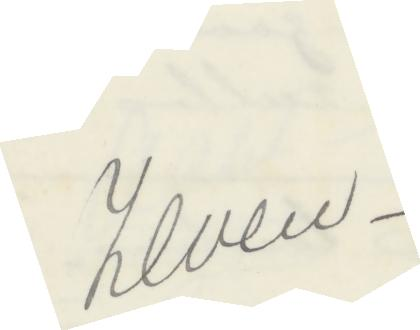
Zeven-
